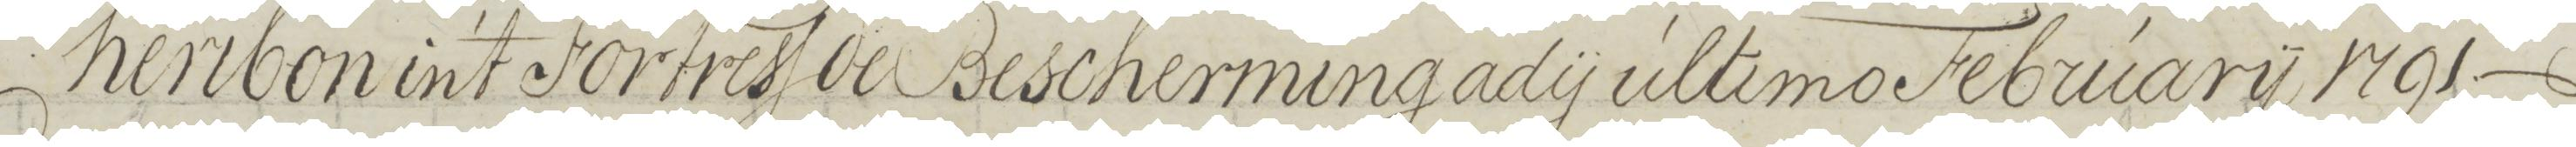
Cheribon in 't Fortress de Bescherming adij ultimo Februarij 1791. —
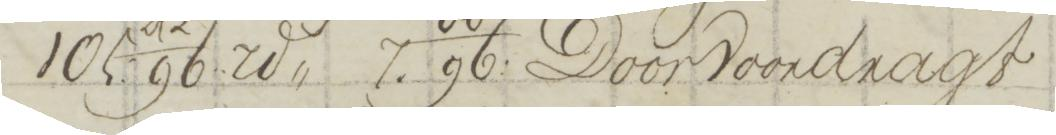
105: 42/96: rd„s 7. 66/96: Door voordragt
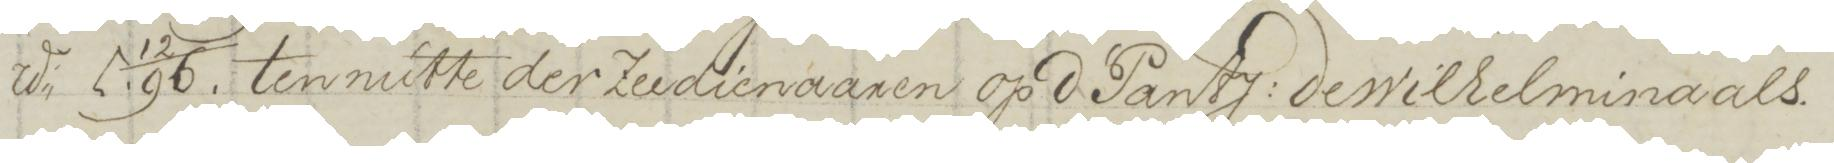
rd„s 5. 12/96. ten mitte der zeedienaaren op d' Panty: de wilhelmina als.
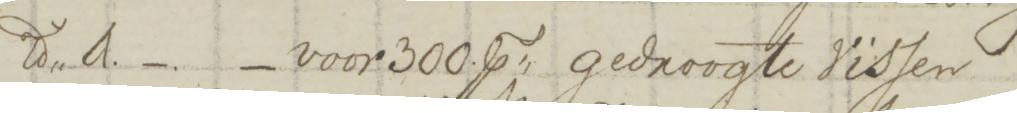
rd„s 4. —. — voor 300. p„s gedroogte vissen
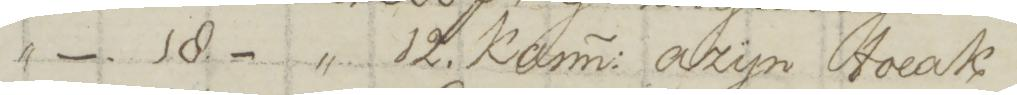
„ —. 18. — „ 12. kann: azijn toeak
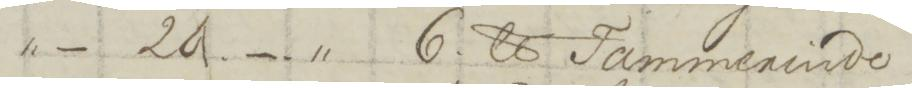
„ — 24. —. „ 6. lb Tammerinde
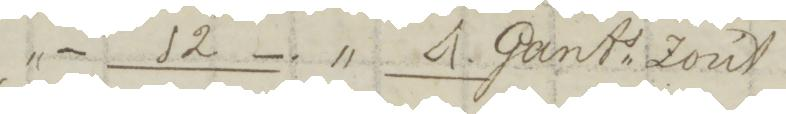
„ — 12 —. „ 4. Gant„s zout
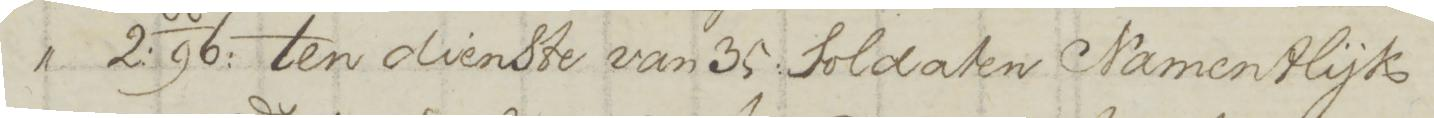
„ 2: 66/96: ten dienste van 35: soldaten Namentlijk
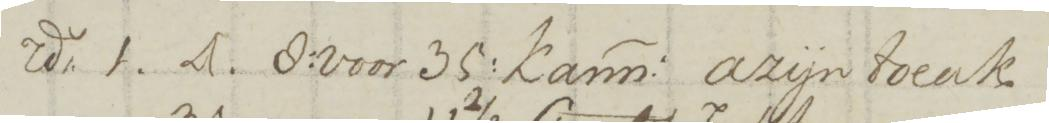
rd„s 1. 4. 8: voor 35: kann: azijn toeak
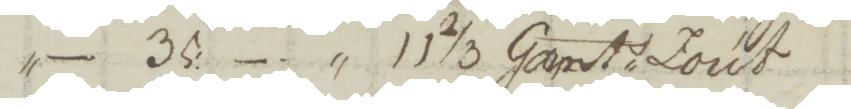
„ — 35: —. „ 11 2/3 Gamt„s zout
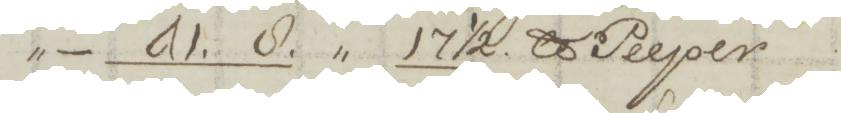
„ — 41. 8. „ 17½. lb Peeper
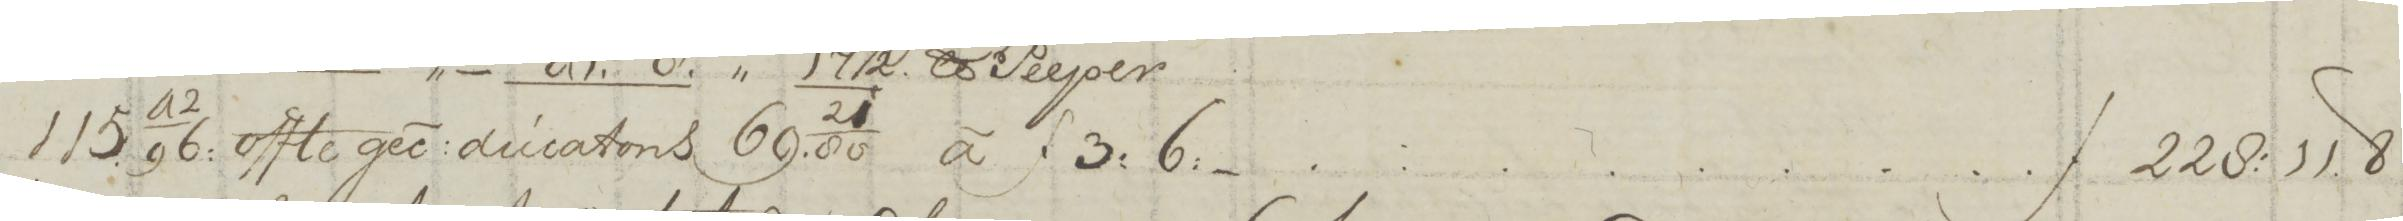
115: 42/96: offte gec: ducatons 69. 21/85 â ƒ 3: 6: — - - - - - - - - - ƒ 228: 11. 8
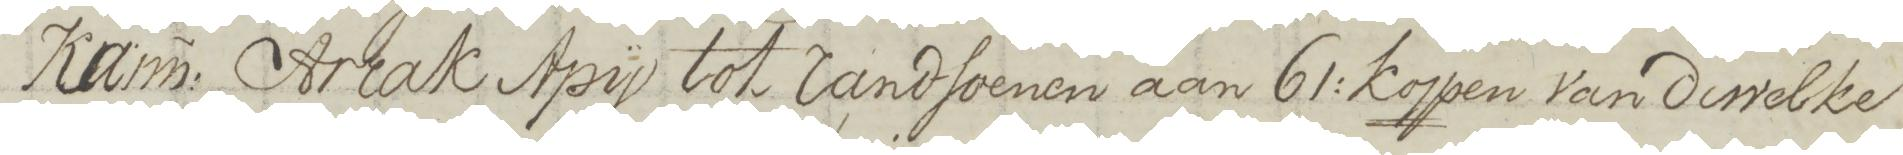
Kann: Arrak Apij tot randsoenen aan 61: koppen van dewelke
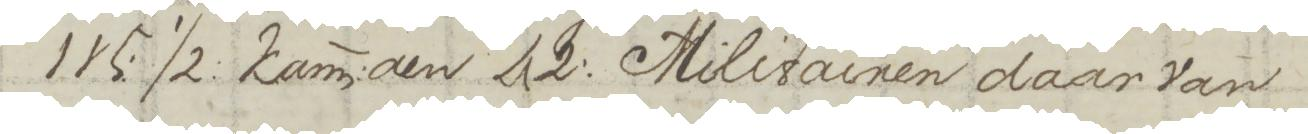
115: ½: kann: den 42: Militairen daar van
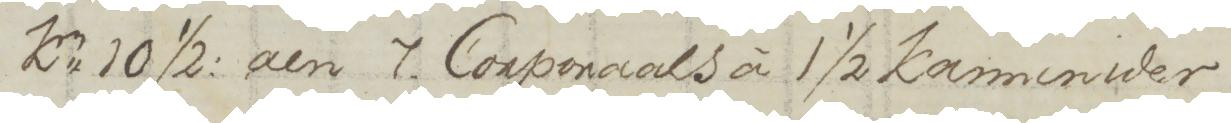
k„n 10 ½: aen 7. Corporaals â 1½ kannen ider
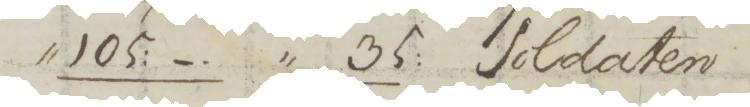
„ 105: —. „ 35: soldaten
